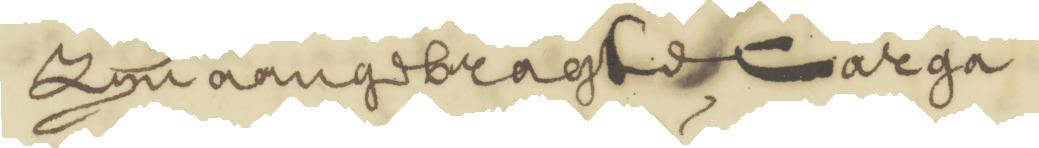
zijn aangebragte Carga
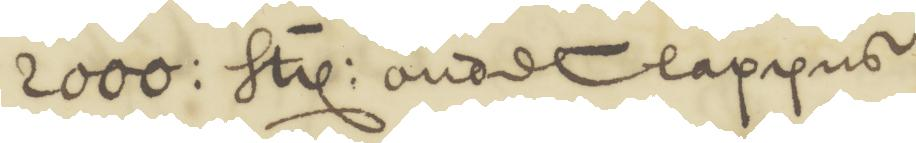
2000: stx: oude Clappus
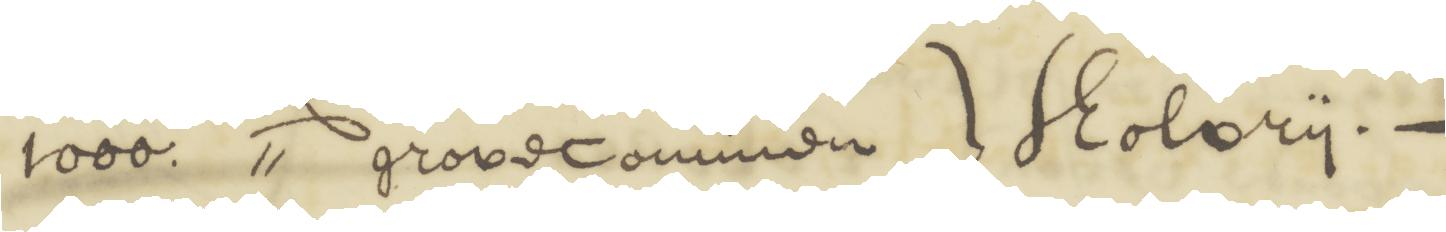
1000: „ grove commen } tholvrij. —
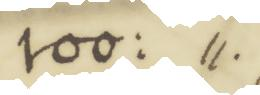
100: „ .
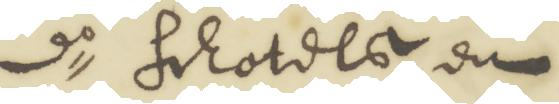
d„o schotels, en
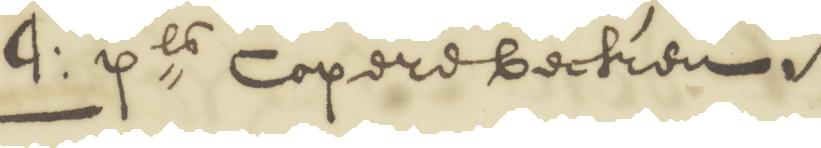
4: p„ls Copere becken
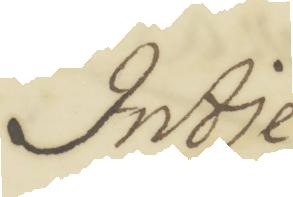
Intje
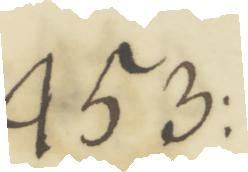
453:
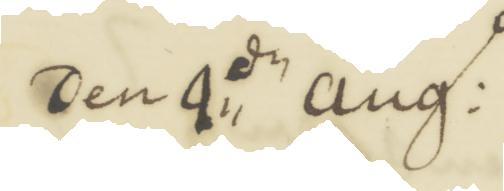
den 4„en aug:o
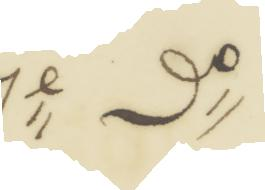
7„e d„o
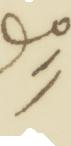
d„
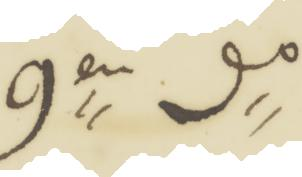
9„en d„
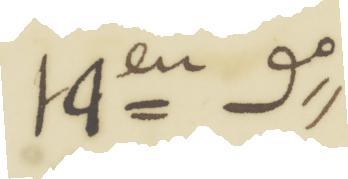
14=en d„o
